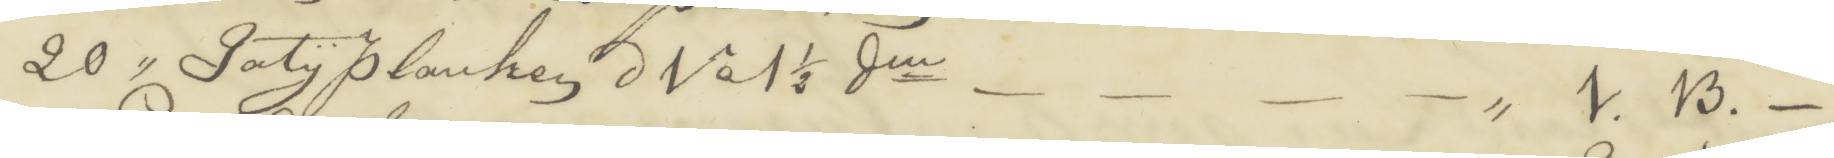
20 „ Iatij planken d 1 â 1 1/3 d=m — — — — „ 1. 13. —
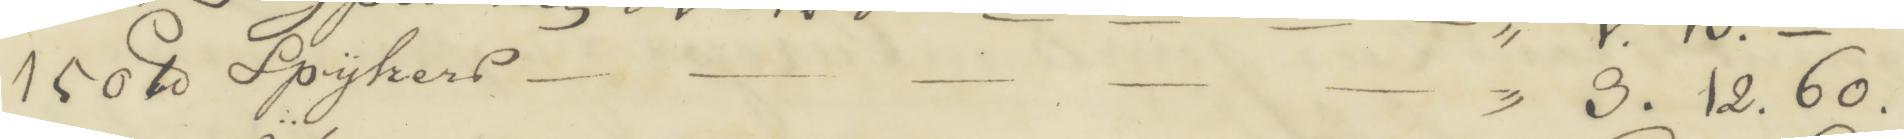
150 lb spijkers — — — — — „ 3. 12. 60.
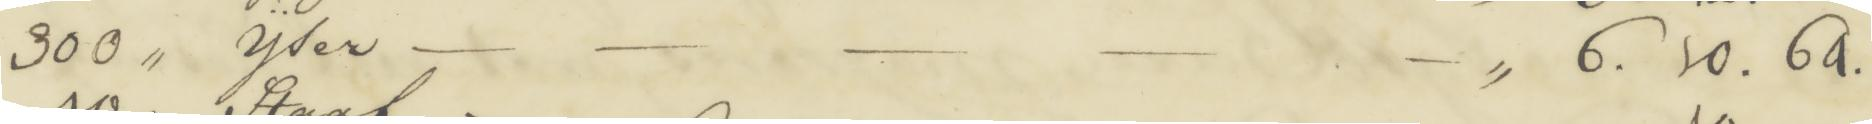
300 „ ijser — — — — — „ 6. 10. 64.
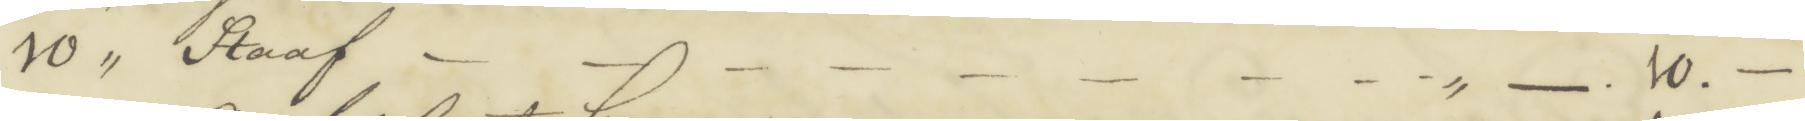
10 „ staaf — — — — — — — — „ —. 10. —
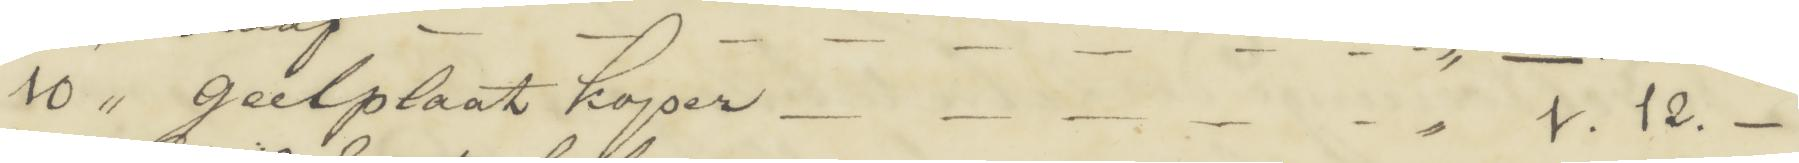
10 „ geelplaat koper— — — — — „ 1. 12. —
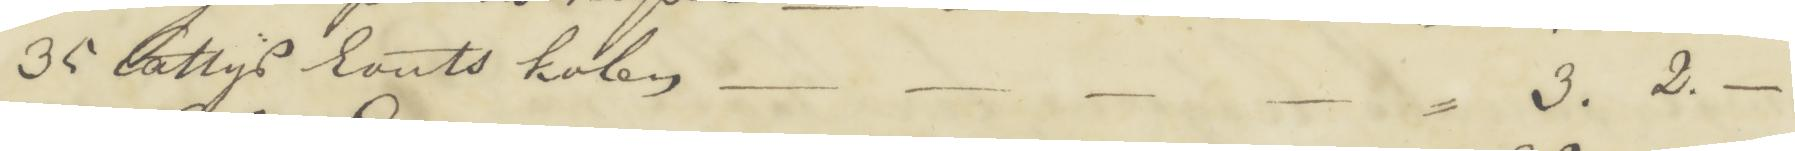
35 Cattijs houts kolen — — — — „ 3. 2. —
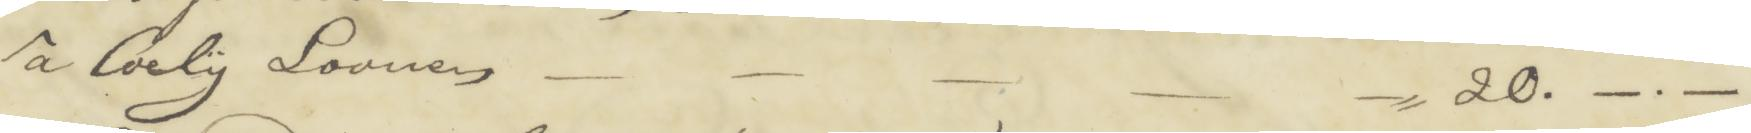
â Coelij Loonen — — — — — „ 20. —. —
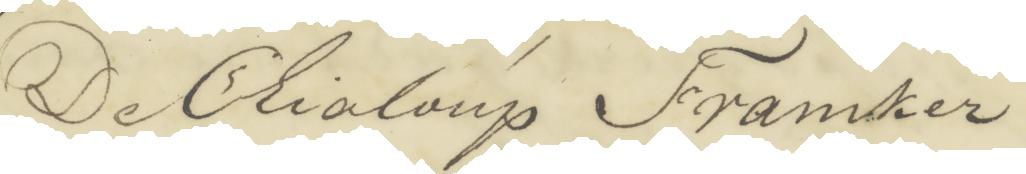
De Chialoup Franiker
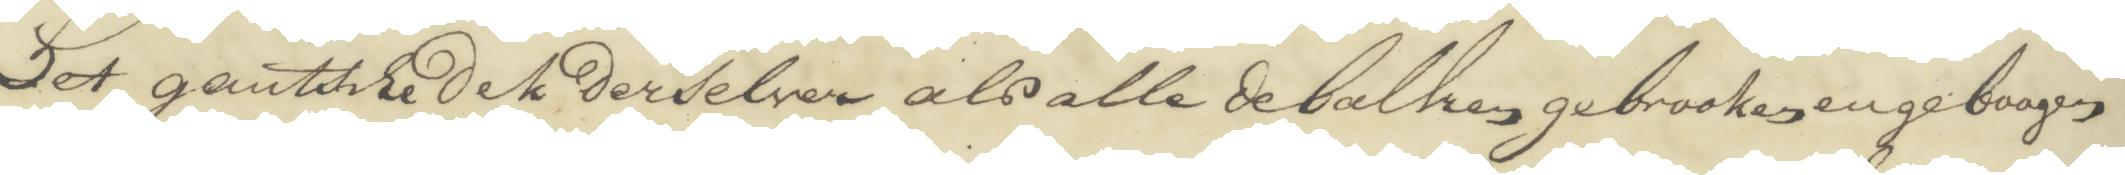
Het gantsche dek derselver als alle de balken gebrooken en geboogen
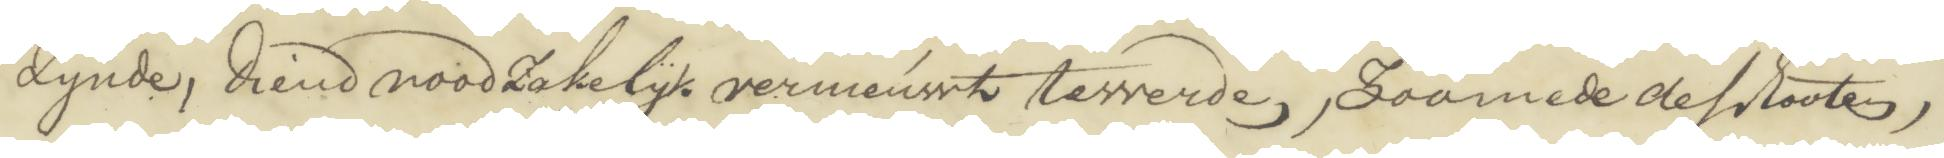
Zijnde, diend noodzakelijk vernieuwt tewerden, Zoo mede de schooten,
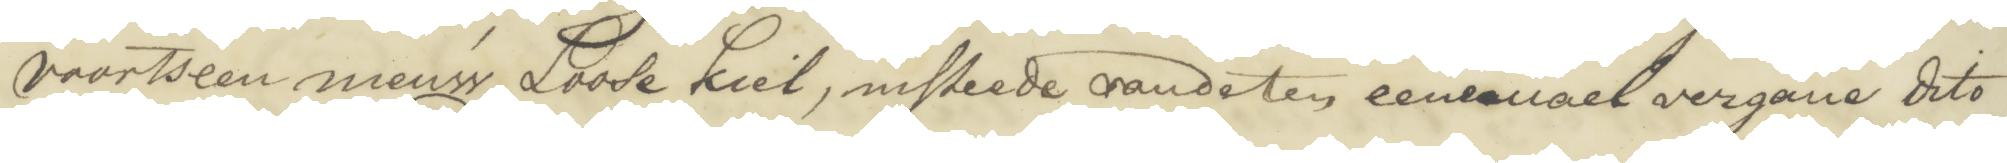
voorts een nieuw, Loose kiel, insteede vande ten eenernael vergane dito
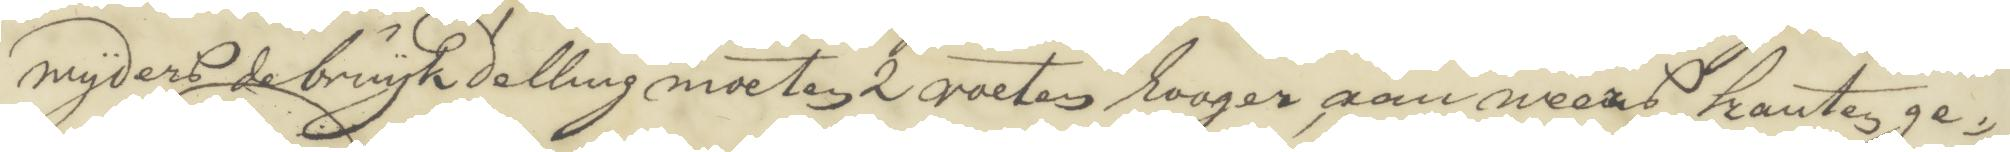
wijders de bruijk delling moeten 2 voeten hooger aan weers kanten ge„
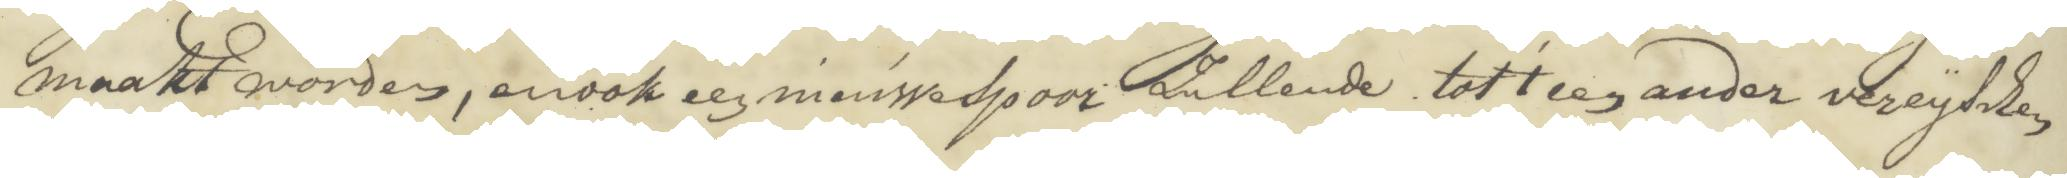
maakt worden, en ook een nieuwe spoor Zullende tot ’t een ander vereijschen
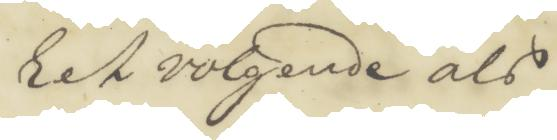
het volgende als
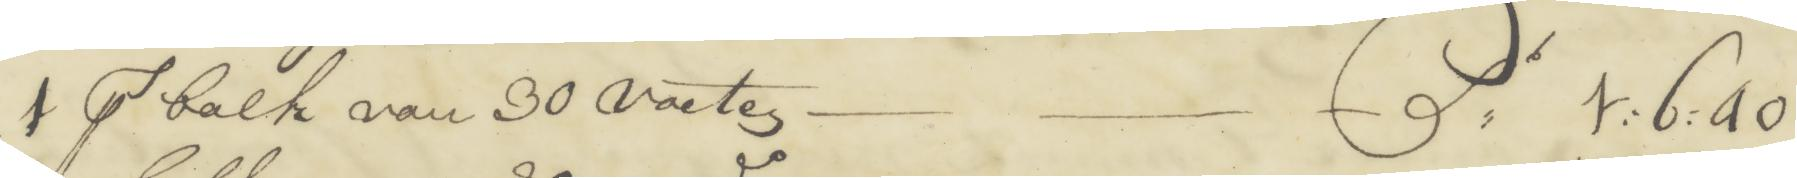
1 ps balk van 30 voeten— — — P„s 1: 6: 40
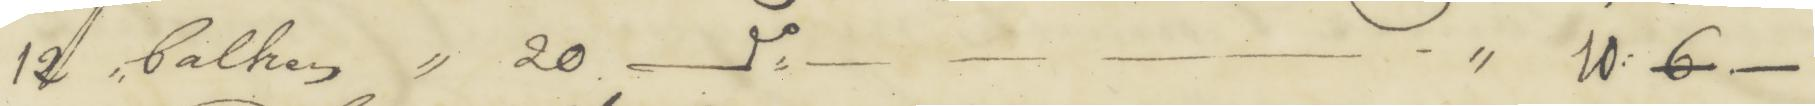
12 „ balken „ 20 —:o — — — — „ 10: 6 —
